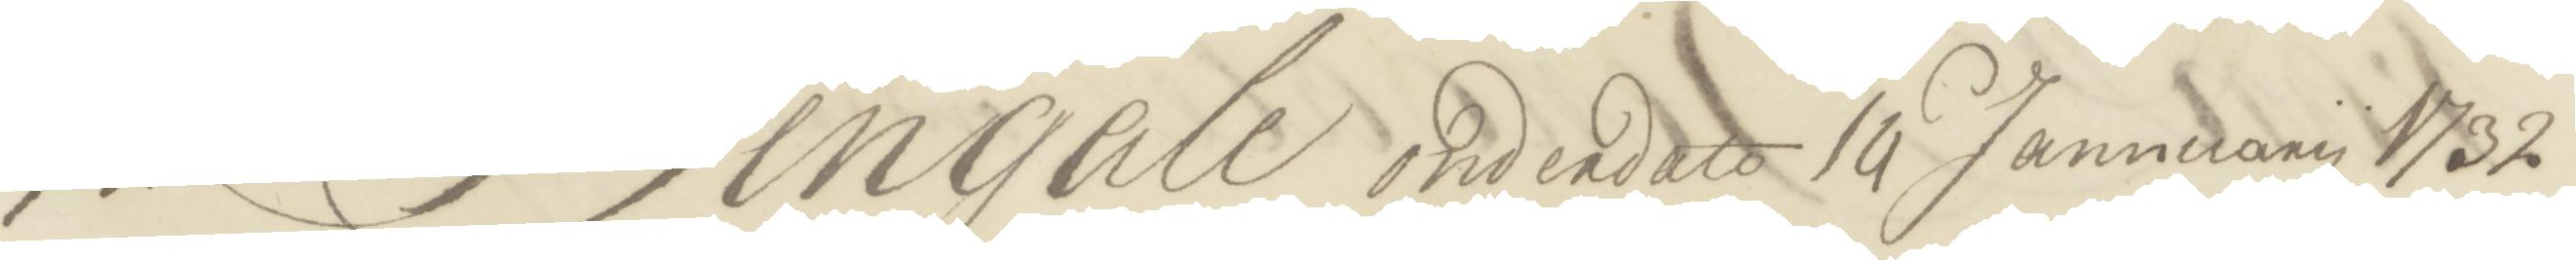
van Bengale onderdato 14' Jannuarij 1732
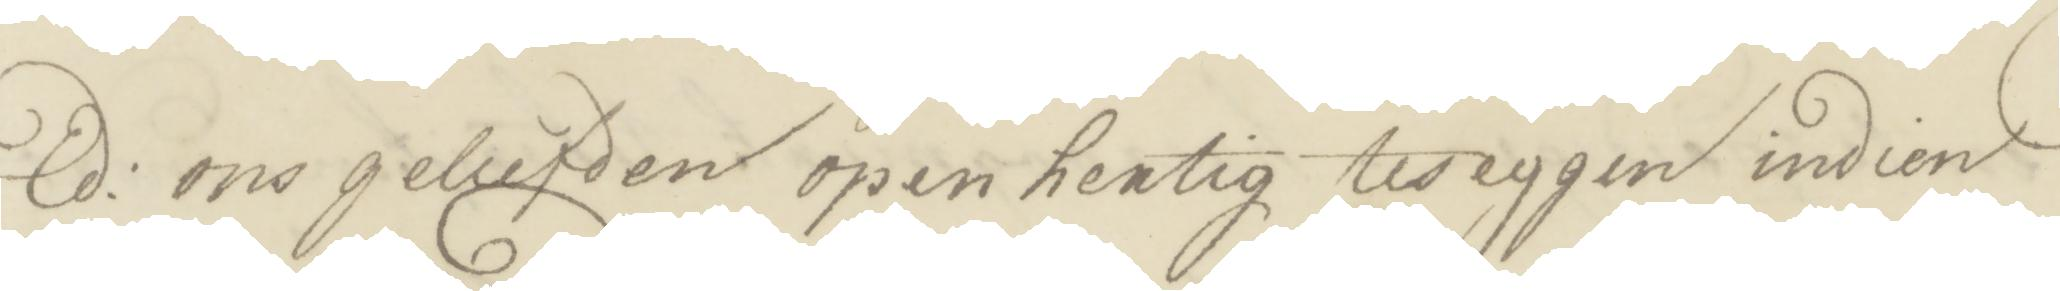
Ed: ons geliefden open hertig teseggen indien
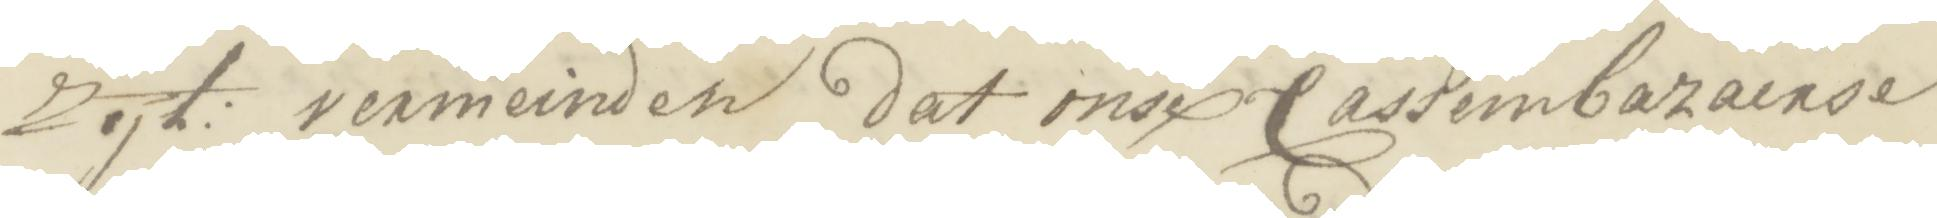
zijt: vermeinden dat onse Cassembazaerse
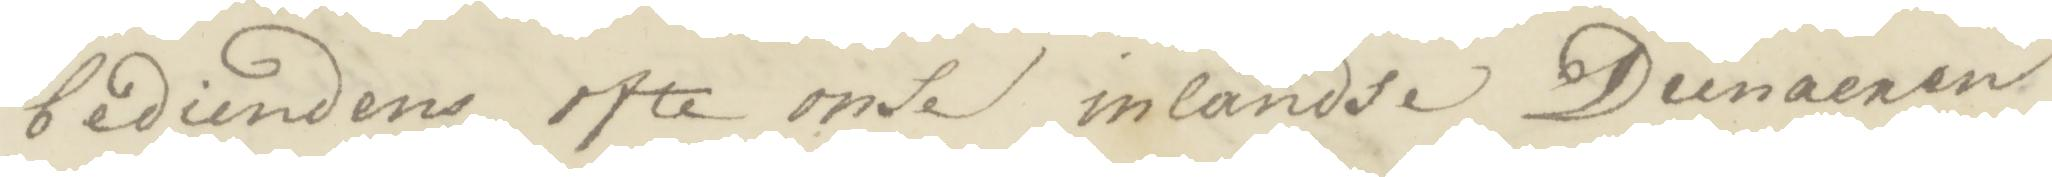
bediendens ofte onse inlandse Dienaeren
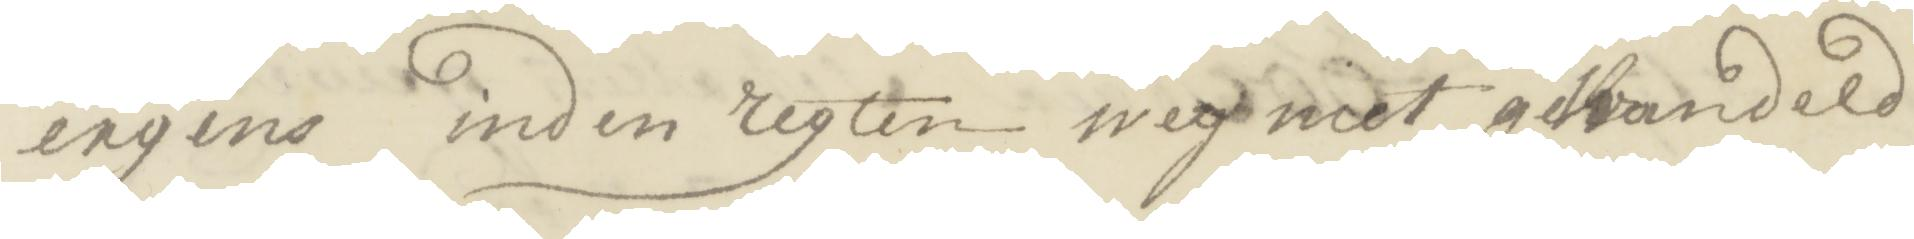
ergens inden regten weg niet gehandeld
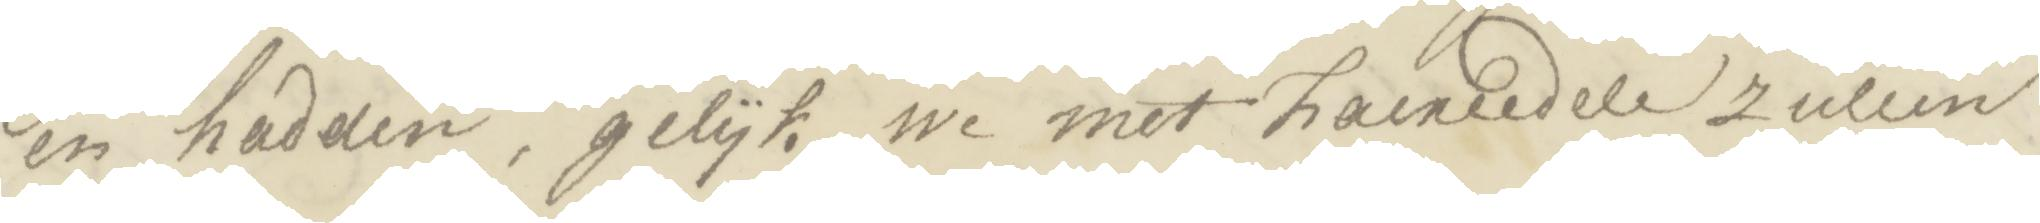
en hadden, gelijk we met haereedele zullen
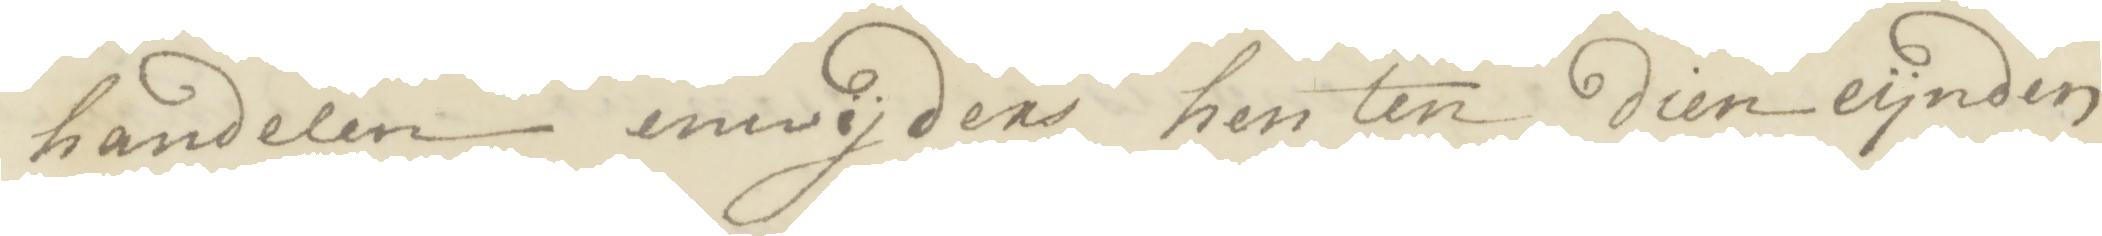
handelen enwijders hen ten dien eijnden
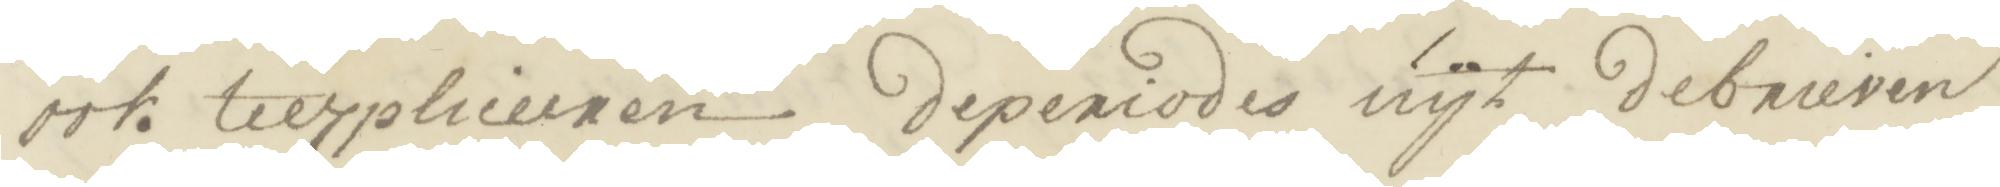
ook teexpliceeren deperiodes uijt debrieven
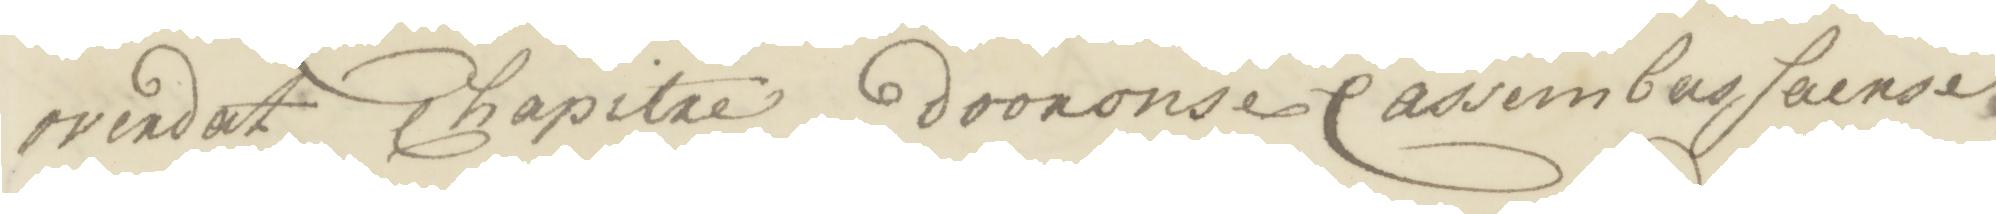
overdat chapitre dooronse Cassembassaerse
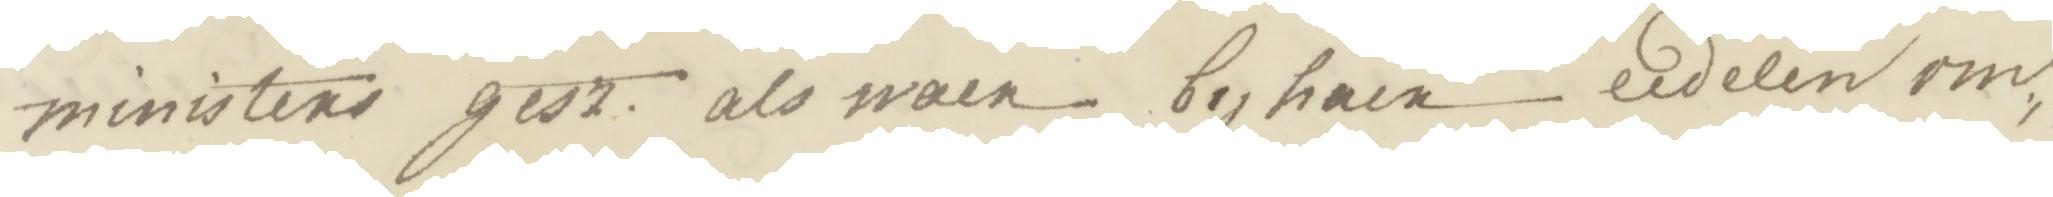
ministers gesz: als waer by haer eedelen om„
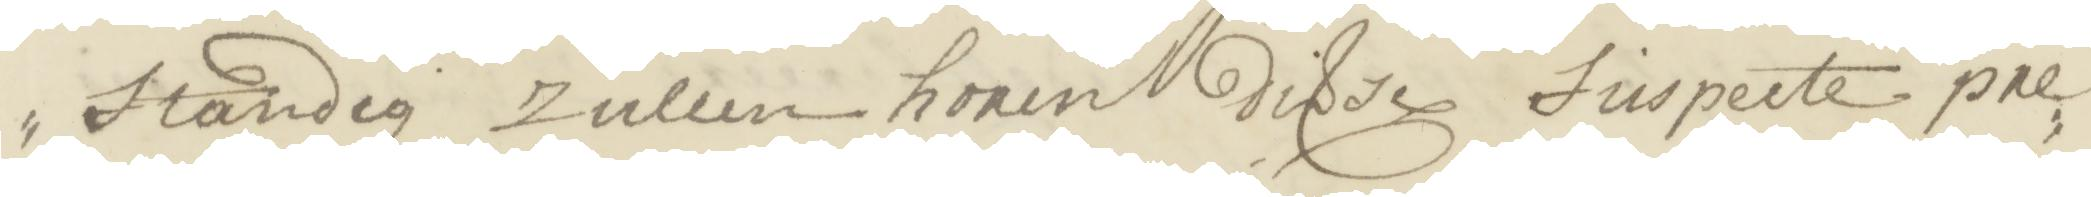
„standig zullen horen diverse suspecte pre„
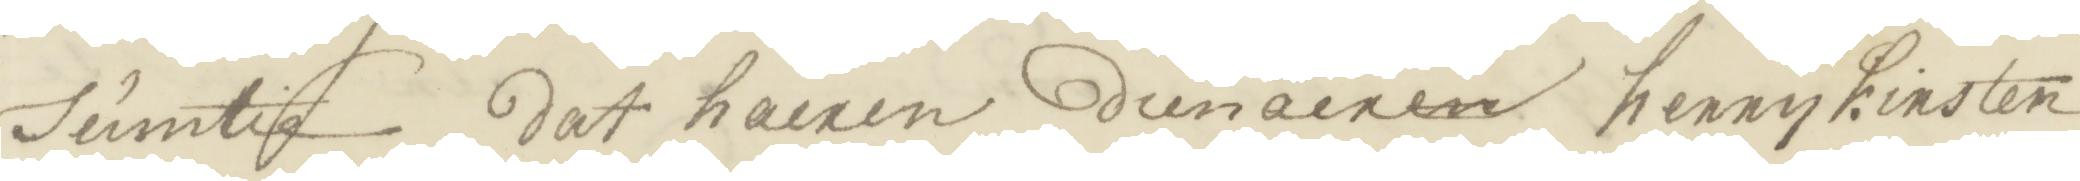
sumtie dat haeren dienaeren henry kirsten
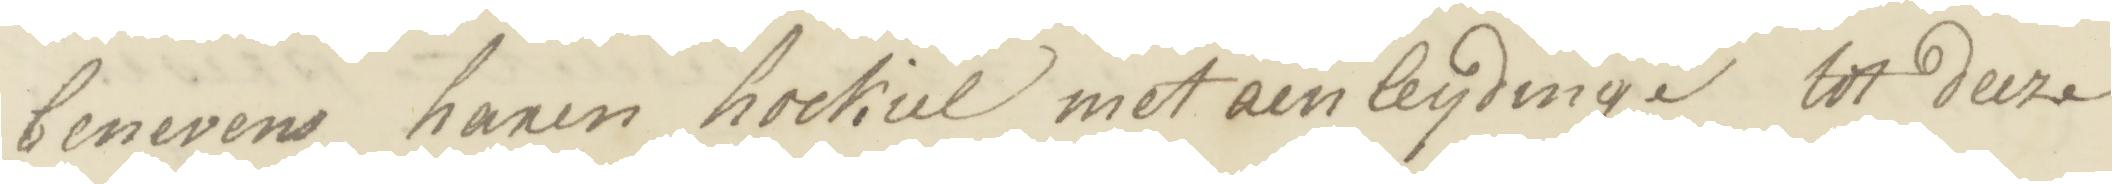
benevens haren hoekiel met aen leydinge tot deeze
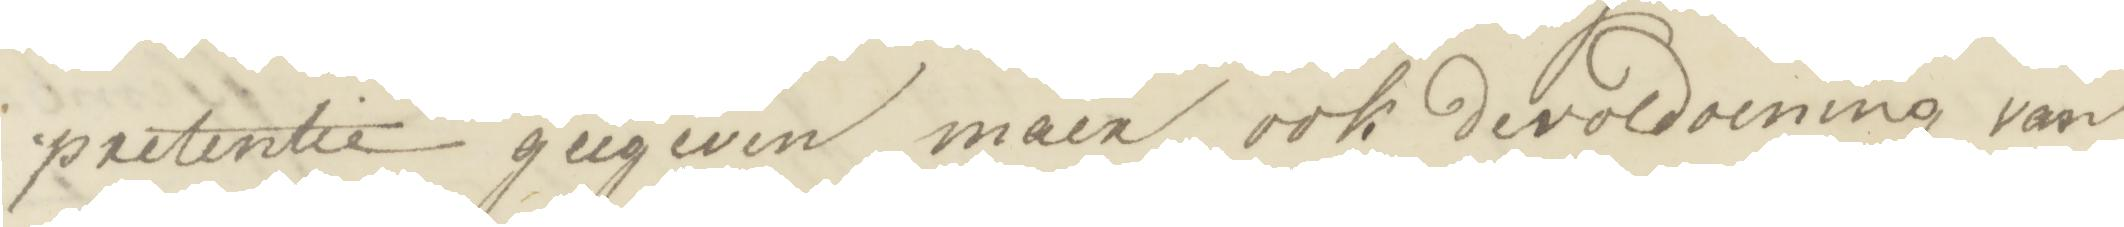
pretentie geegeven maer ook devoldoening van
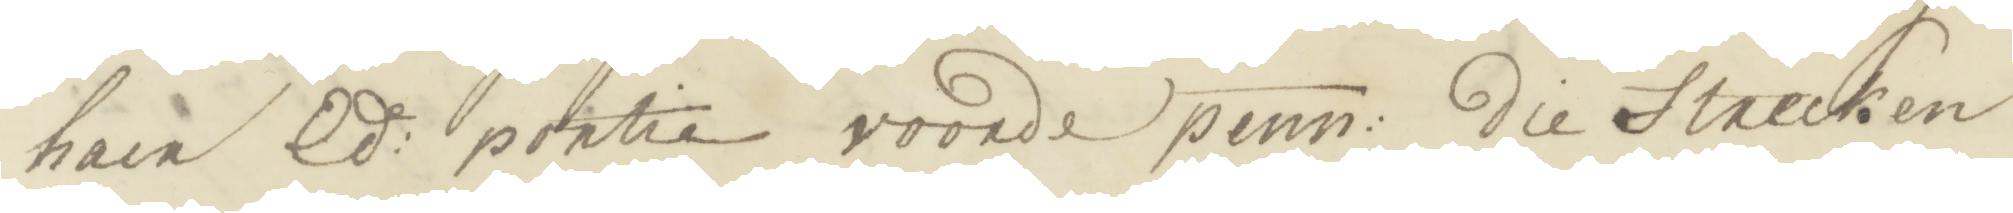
haer Ed: portie voorde penn: die strecken
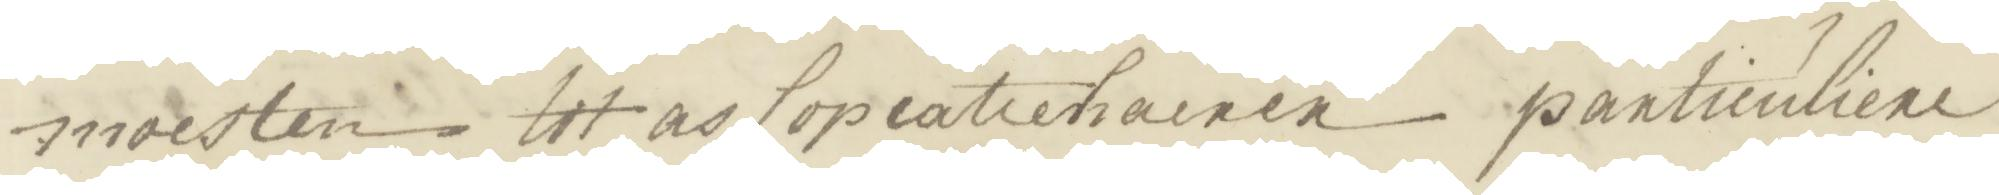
moesten tot as sopiatie haerer particuliere
